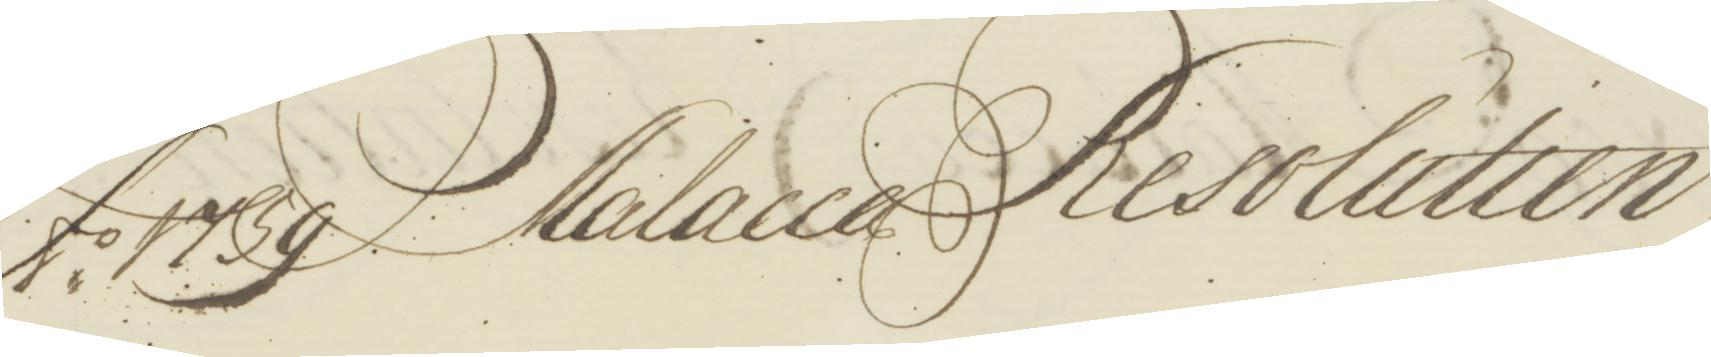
A„o 1759 Malacca Resolutien
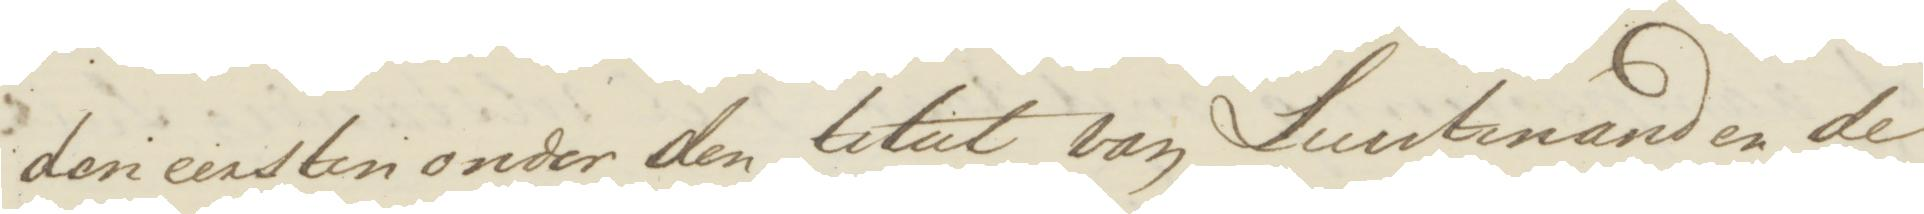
den eersten onder den titul van Luutinand en de
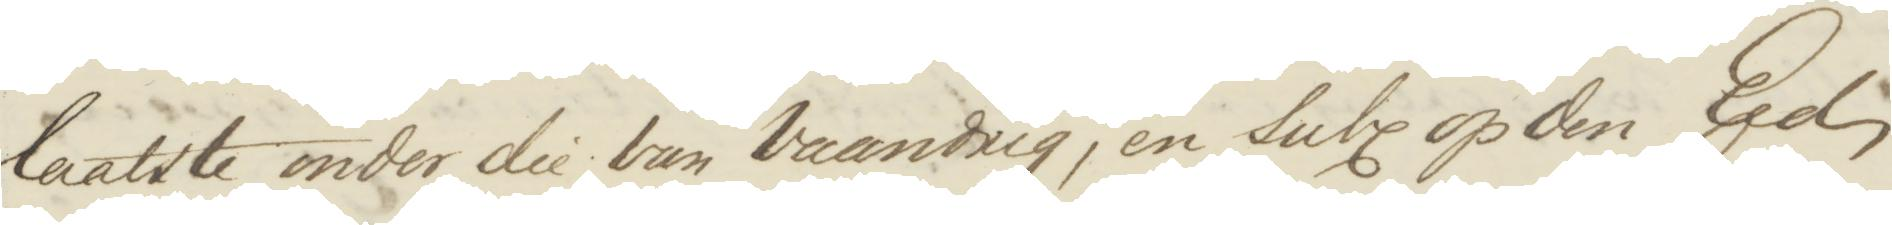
laatste onder die van vaandrig, en sulx op den Eed
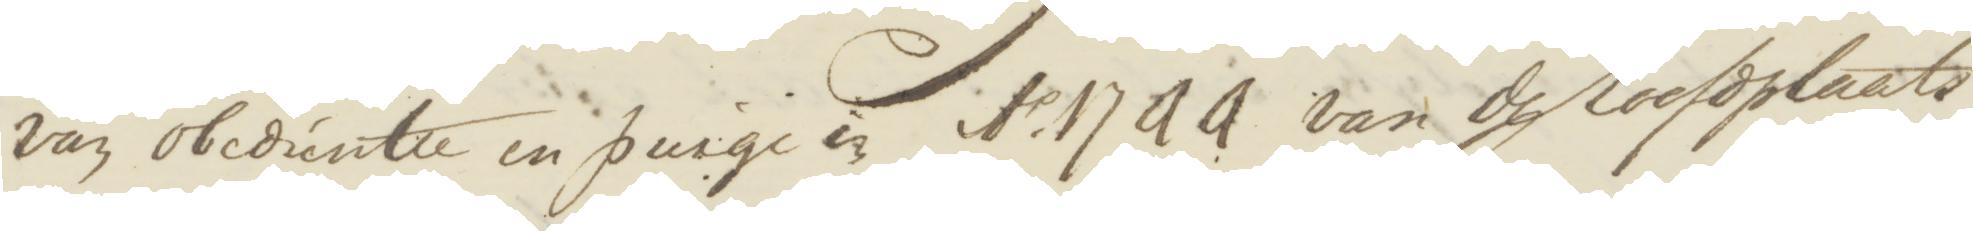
van obedientie en purge in A.o 1744 van de hoofdplaats
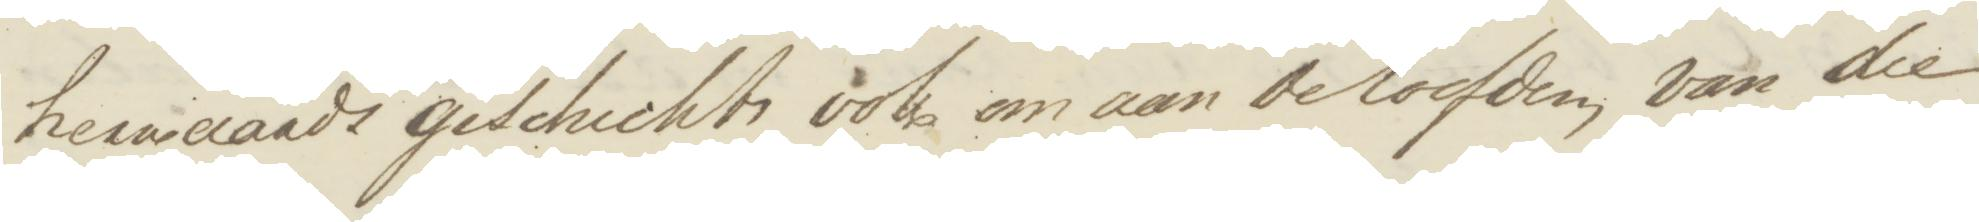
herwaards geschickt ook om aan behoefden van die
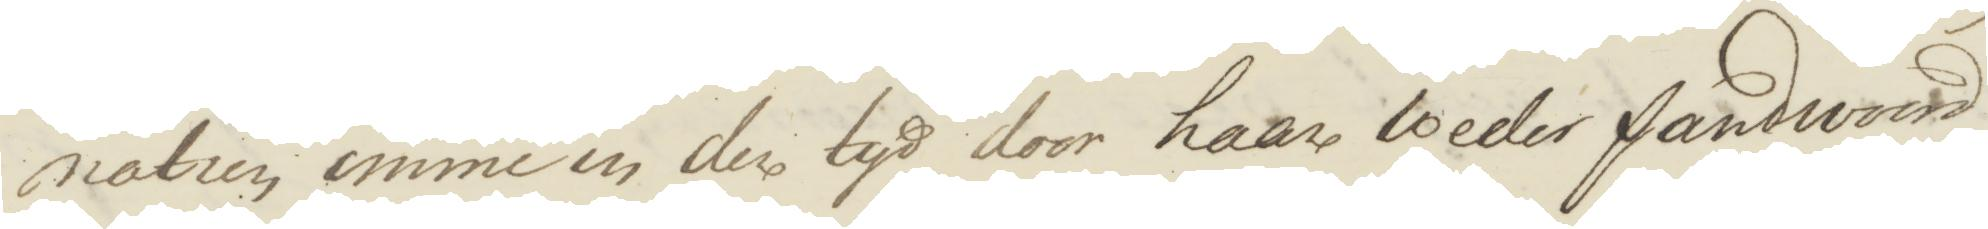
natien omme in der tyd door haar weder gandwoord
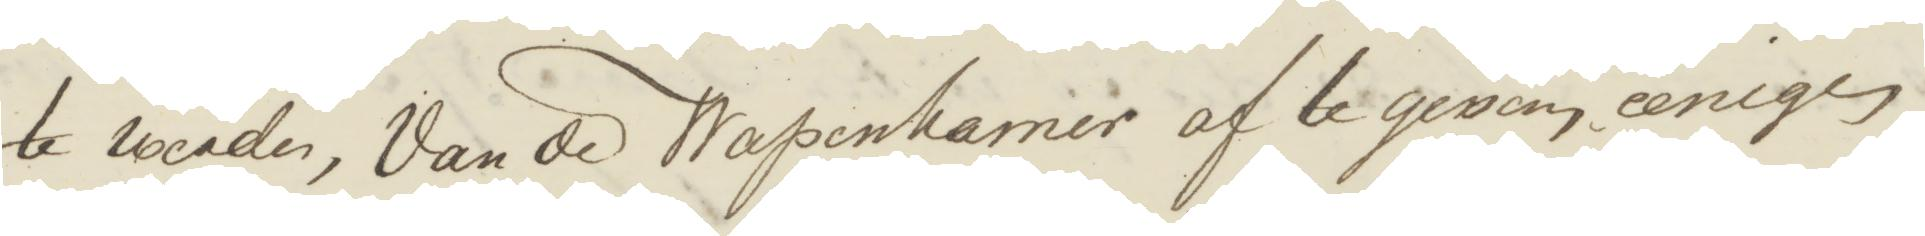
te werden, van de Wapenkamer af te geven eenige
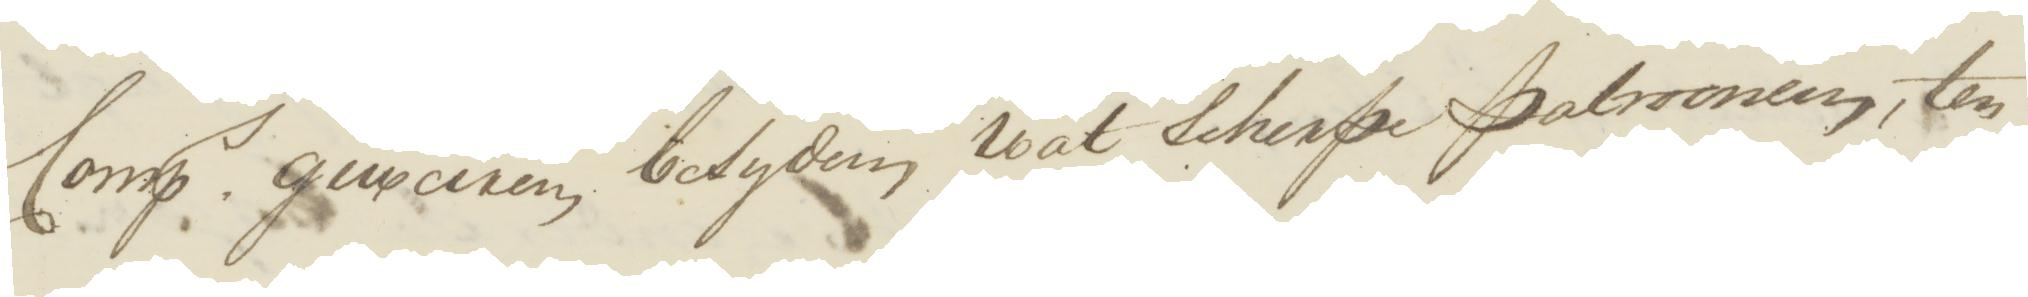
Comp.s geweiren besyden wat scherpe Patroonen, ten
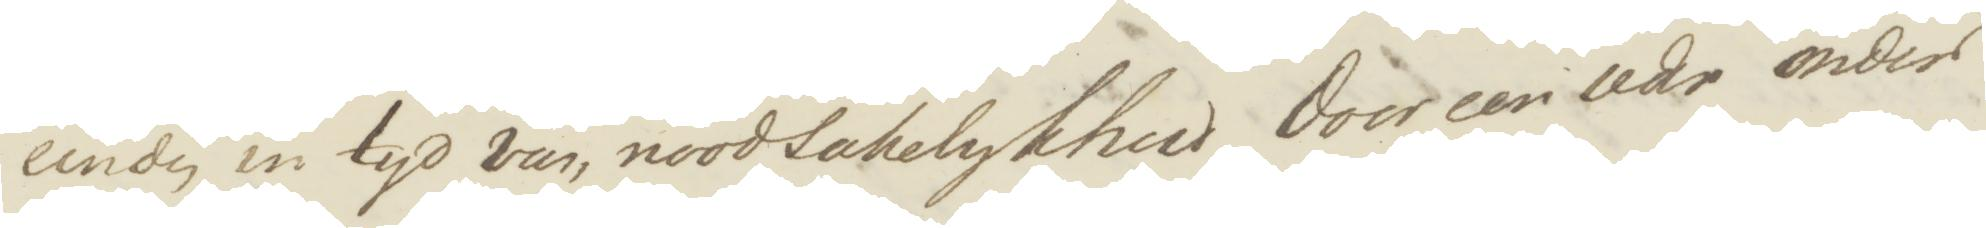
einde in tyd van noodsakelykheid door een ieder onders
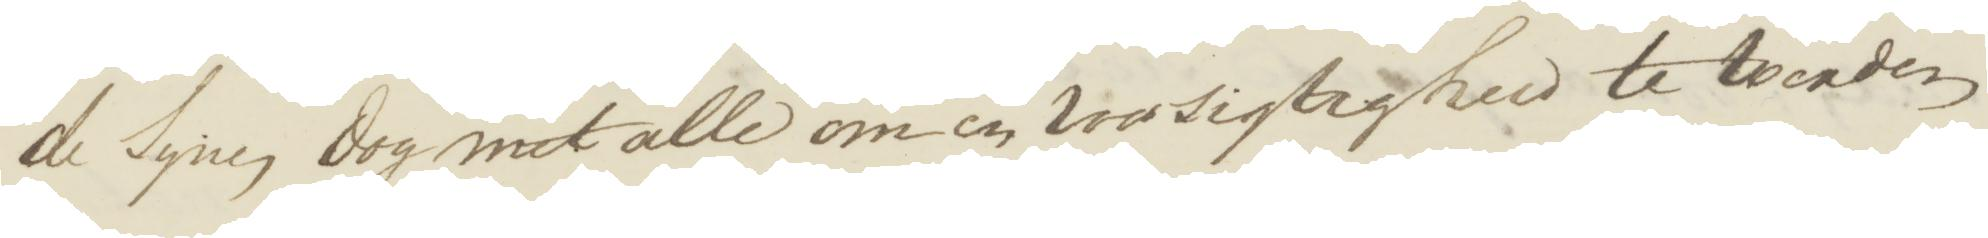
de sijne dog niet alle om en voorsigtigheid te werden
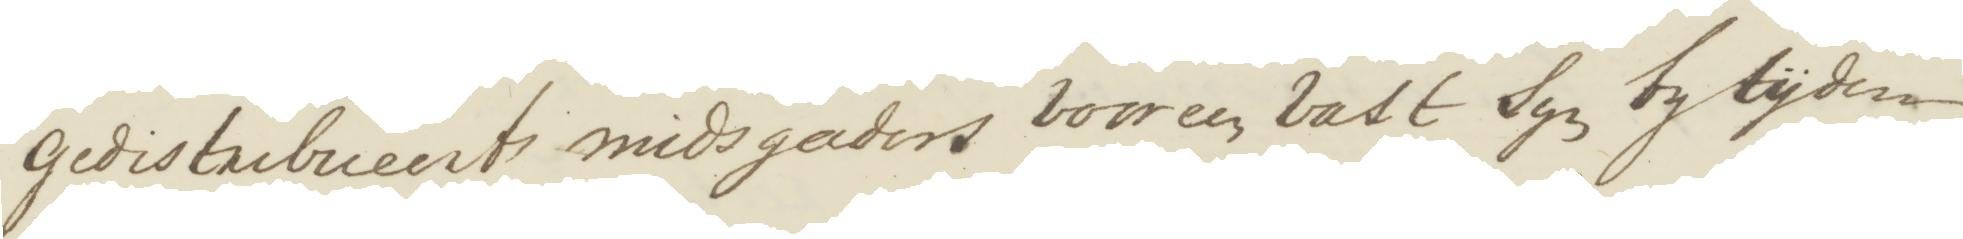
gedistribueert midsgaders voor een vast syn by tijden
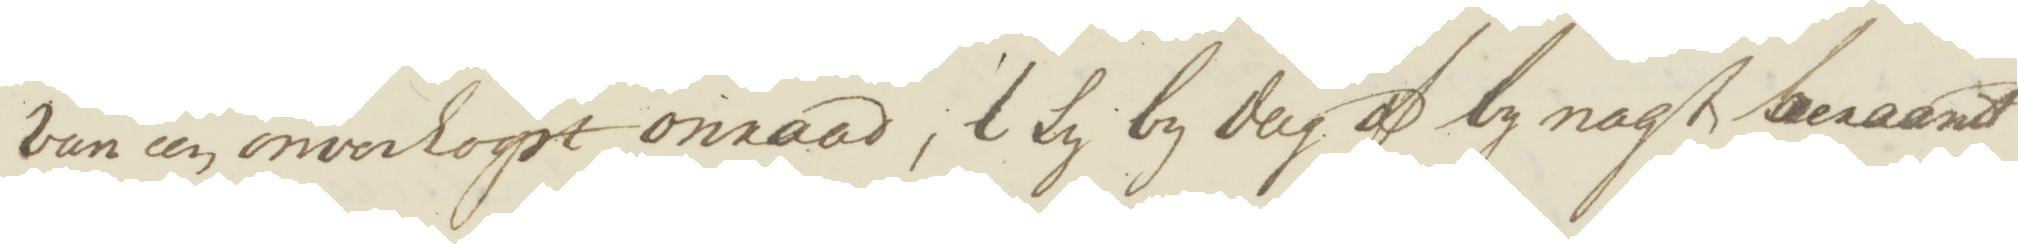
van een onverhoopt onraad; ’t sy by dag of by nagt beraamt
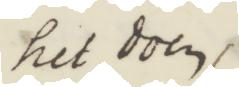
het doen
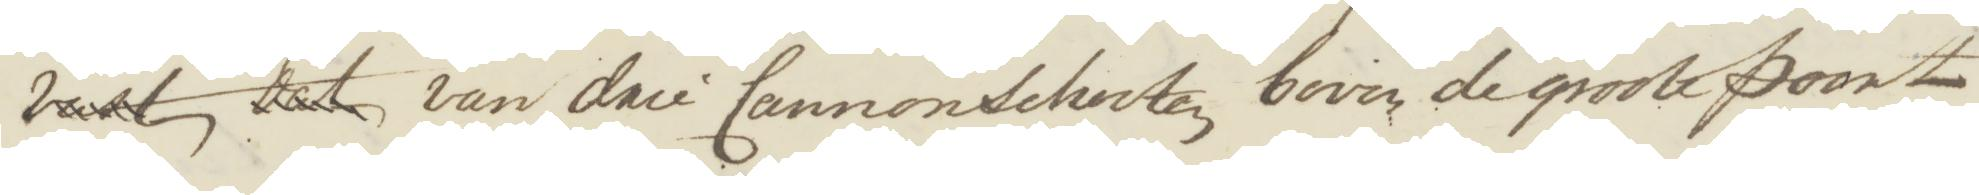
vast dat van drie Cannonschoten boven de groote poort
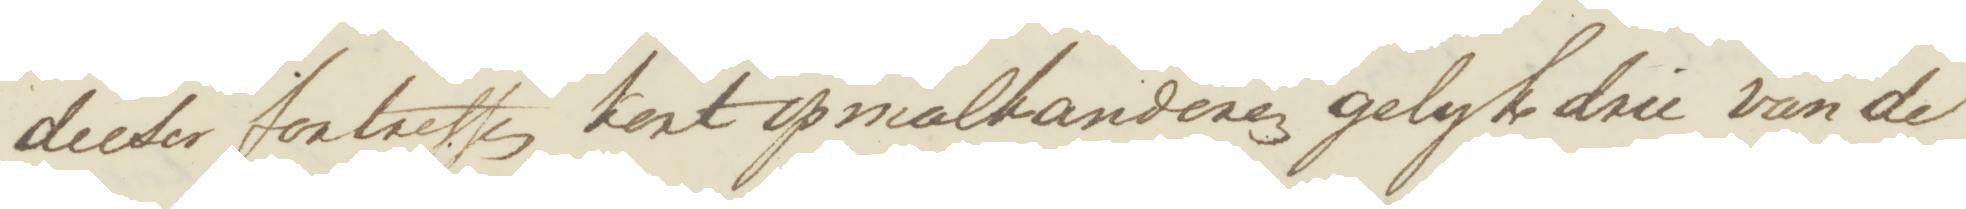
deeser fortresse kert op malkanderen gelyk drie van de
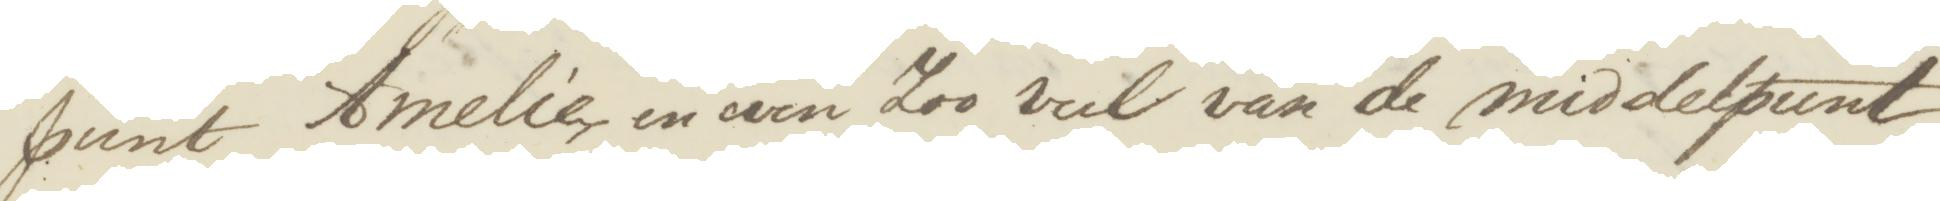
punt Amelie en aen zoo veel van de middelpunt
